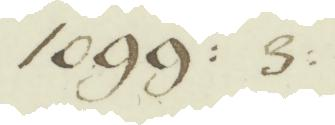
1099: 3:
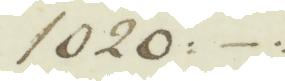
1020: — :
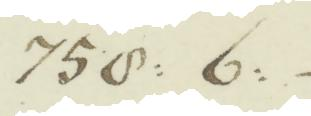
758: 6:
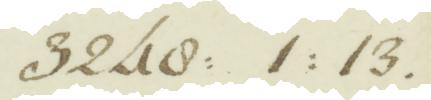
3248: 1: 13.
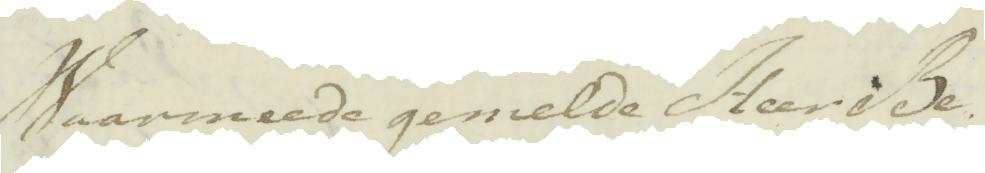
Waarmeede gemelde Heer Be„
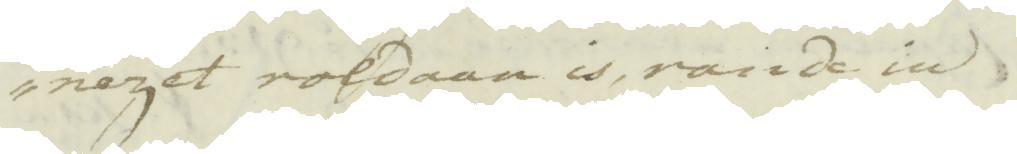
„nezet voldaan is, van de in
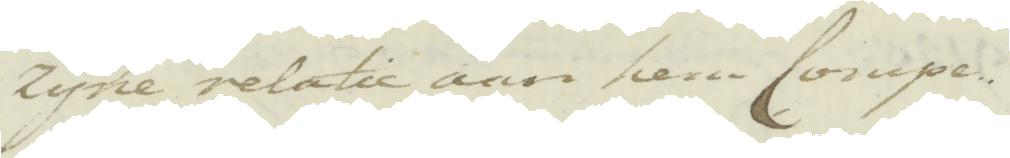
zyne relatie aan hem Compe„
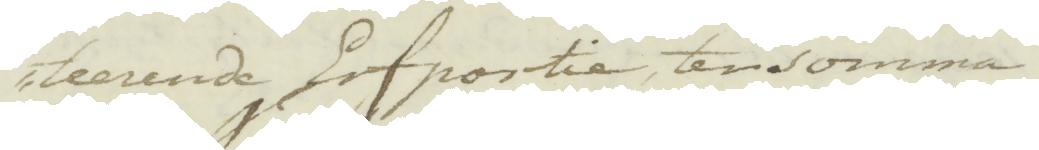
„teerende Erfportie, ten somma
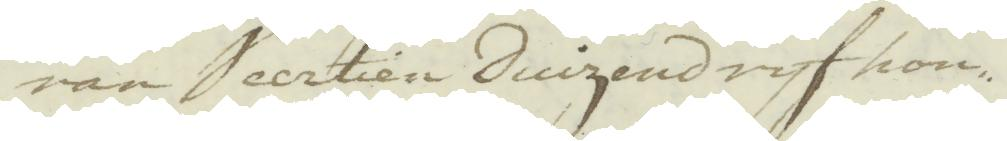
van Veertien duizend vyf hon„
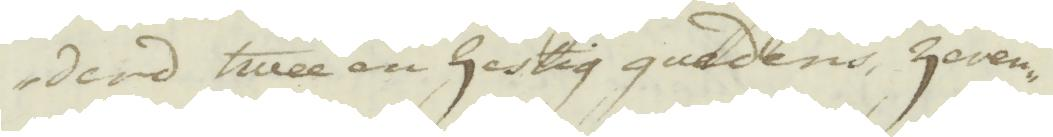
„derd twee en zestig guldens, zeven„
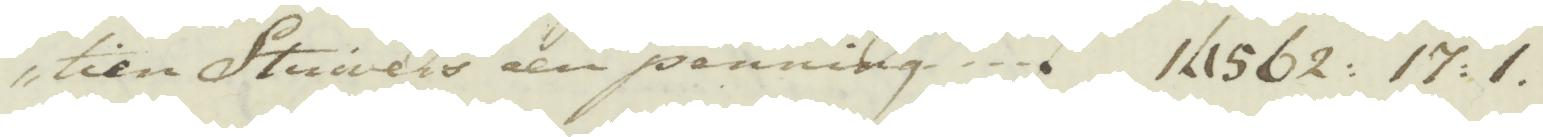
„tien Stuivers een penning - - - - ƒ 14562: 17: 1.
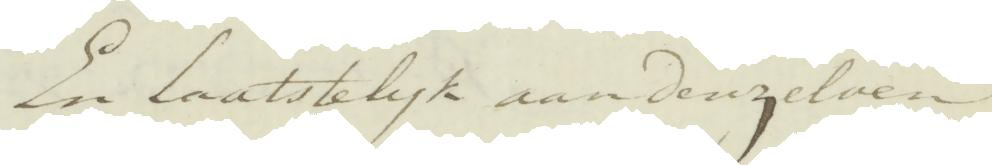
En laatstelijk aan denzelven
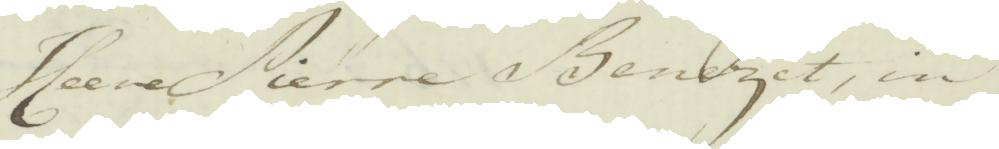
Heere Pierre Benezet, in
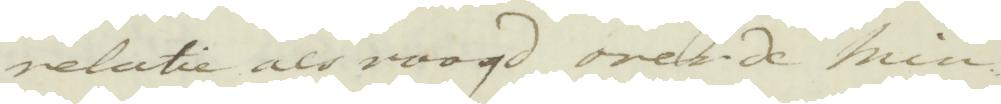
relatie als voogd over de min„
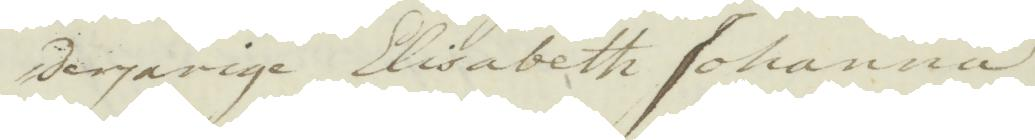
„derjarige Elisabeth Johanna
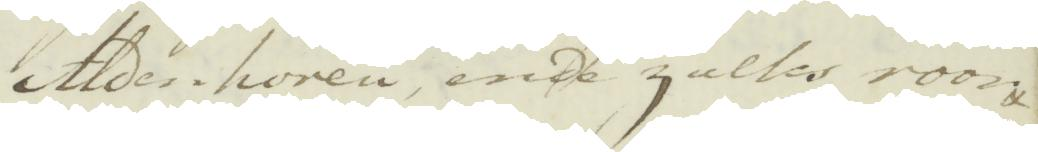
Alden horen, ende zulles voor &
